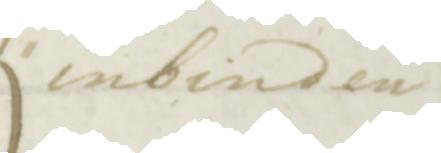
inbinden
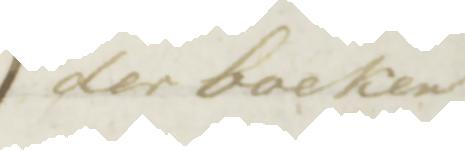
der boeken
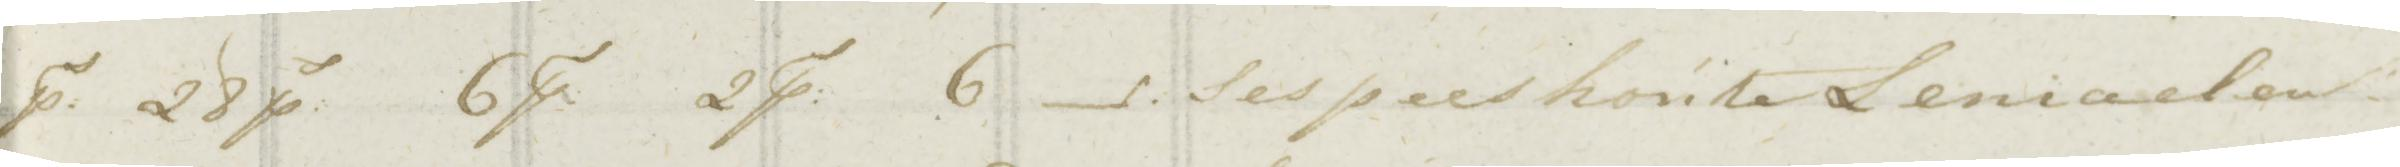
p:s 28 p:s 6p„s 2p:s 6 —: ses pees houte Leniaelen
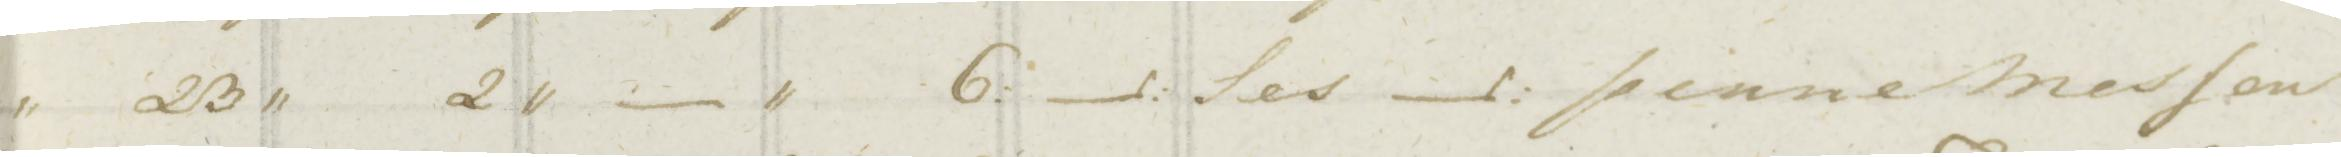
„ 23 „ 2 „ „ 6: —: ses —: penne messen
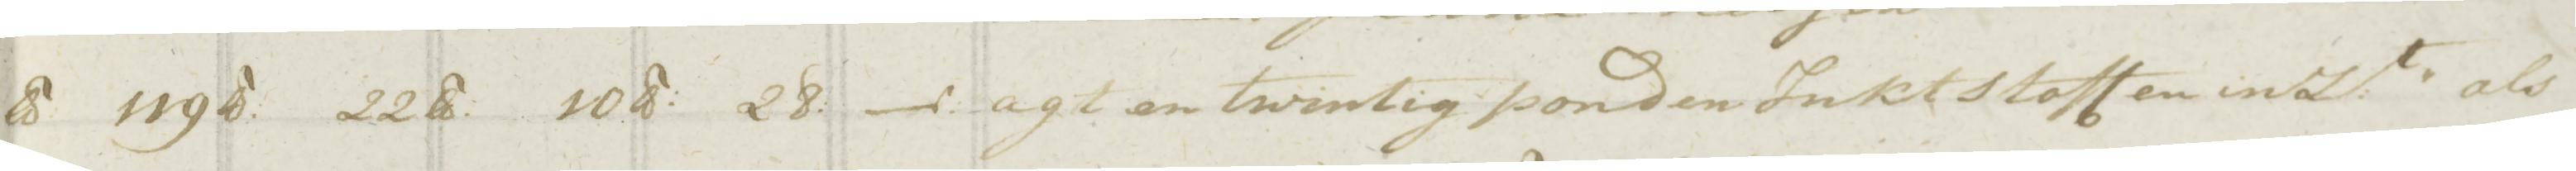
lb 119 lb: 22 lb: 10 lb: 28:—: agt en twintig ponden Inkt stoffen inz:t als
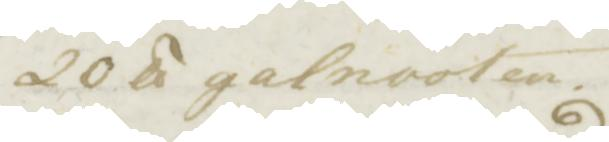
;20 lb galnooten.
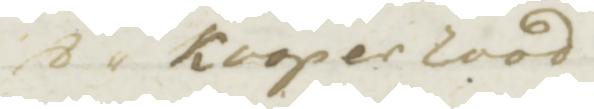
8 „ kooper rood
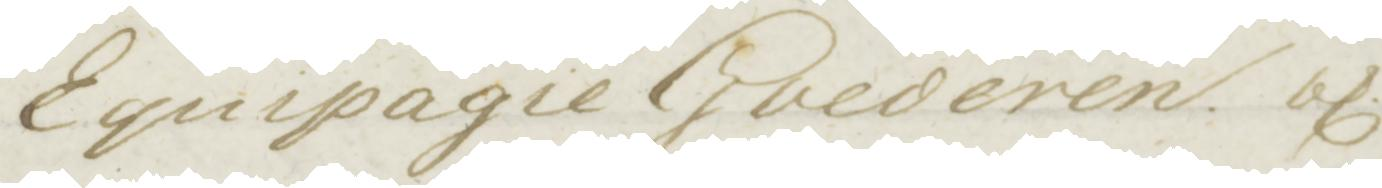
Equipagie Goederen. over
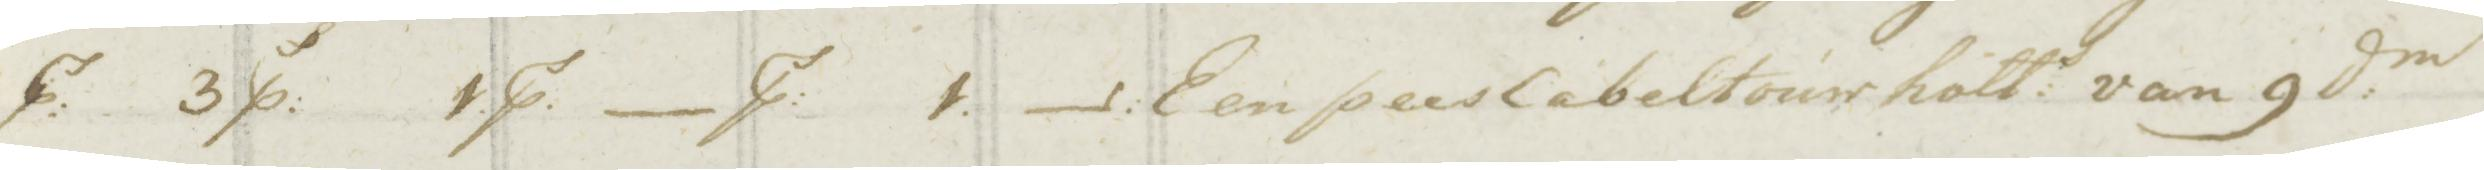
p:s 3 p:s 1 p.s p:s 1. —: Een pees Cabeltouw holt:s van 9 d:m
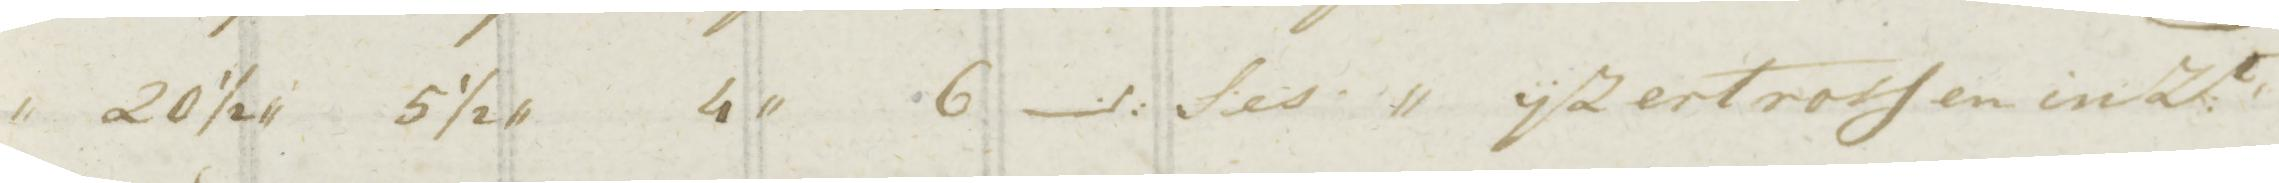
„ 20½„ 5½ „ 4 „ 6 . —: ses „ ijzertrossen in z=t
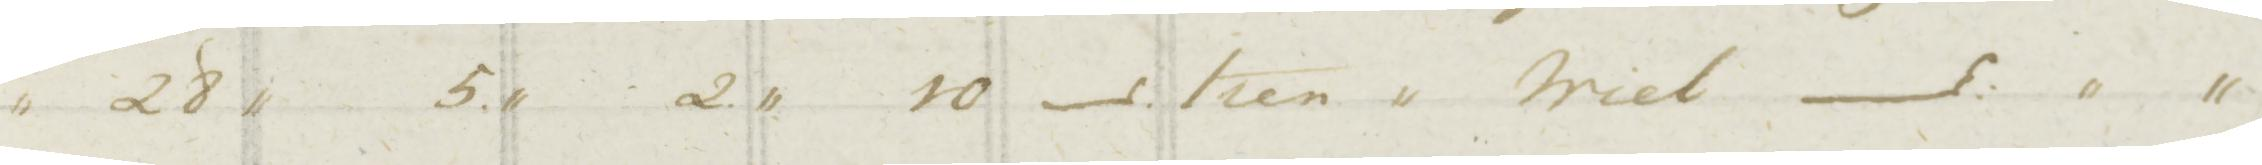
„ 28„ 5.„ 2.„ 10 —: tien „ Wiel —: „ „
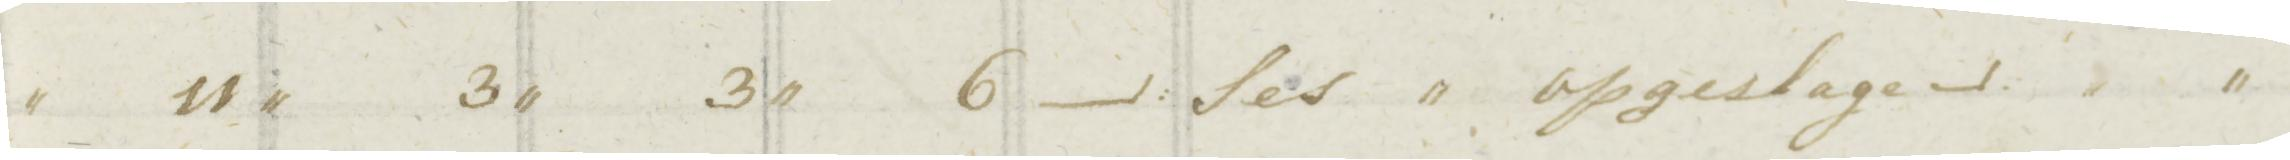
„ 11„ 3„ 3„ 6 —: ses „ opgeslage —: „ „
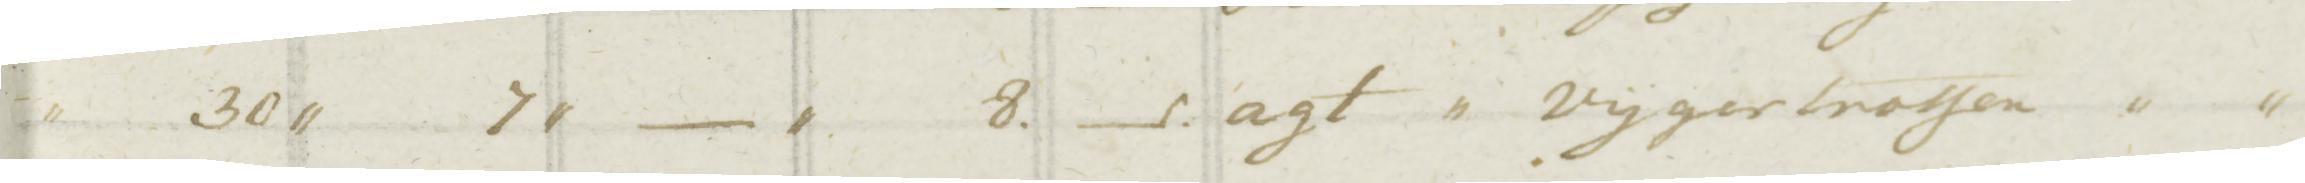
„ 30„ 7„ — „ 8. —:' agt „ vijgertrossen „ „
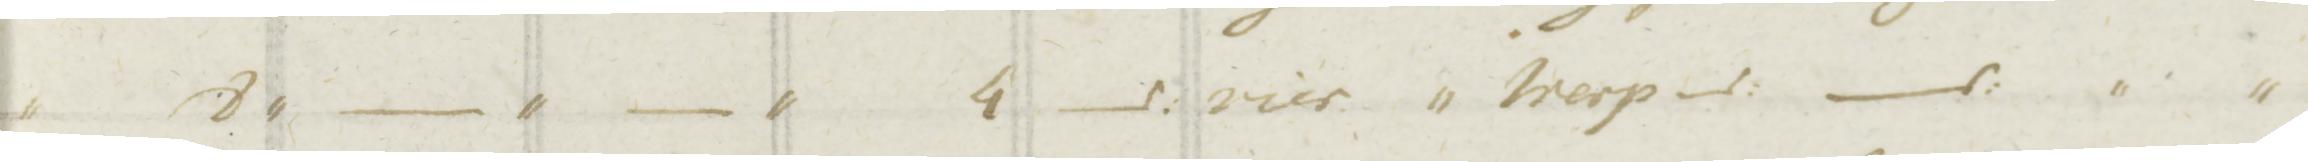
„ 8„— „— „ 4 —: ' vier „ werp-: —: „ „
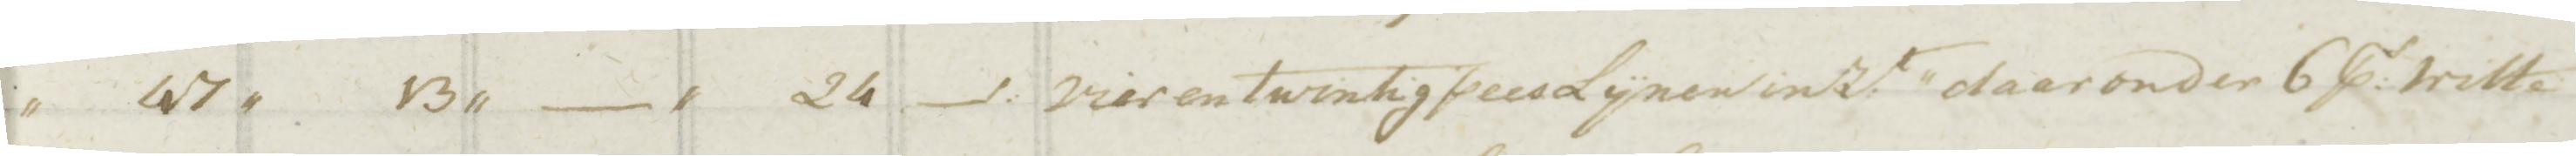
„ 47„ 13„ — „ 24 —: vier en twintig pees Lijnen in z: t daar onder 6 p:s witte
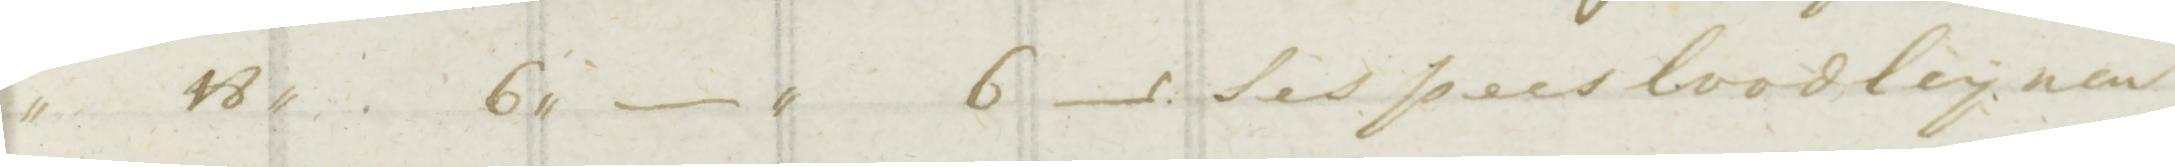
„ 18„ 6„ — „ 6 —: Ses pees loodleijnen
